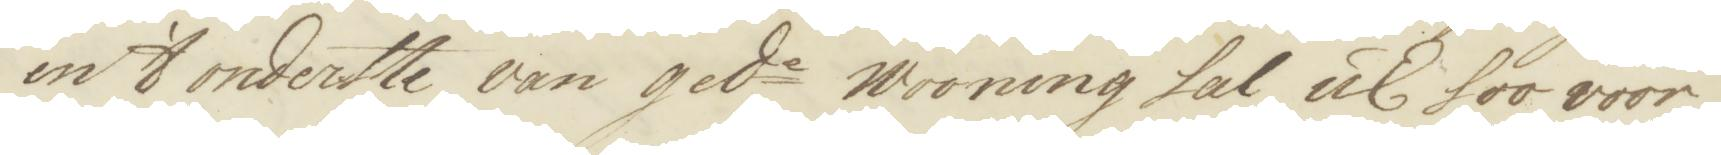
en ’t onderste van ged=e wooning sal uE Soo voor
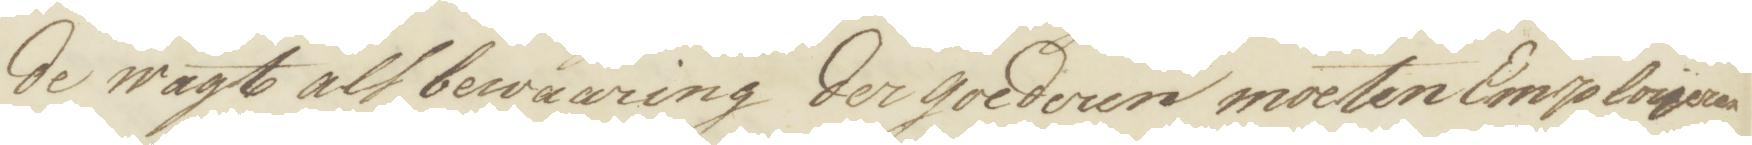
de wagt als bewaaring der goederen moeten Emploijeren
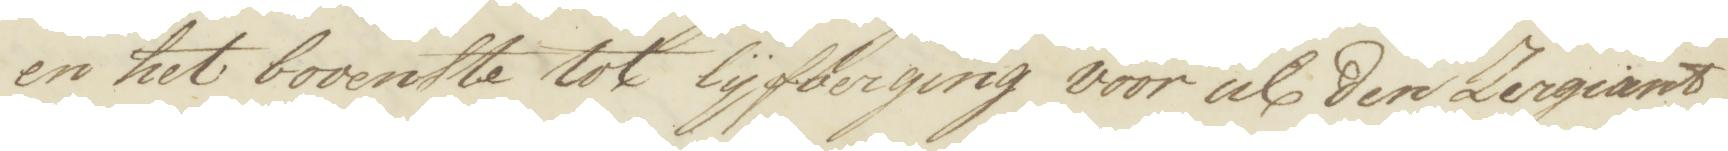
en het bovenste tot lijfberging voor ul den Zergiant
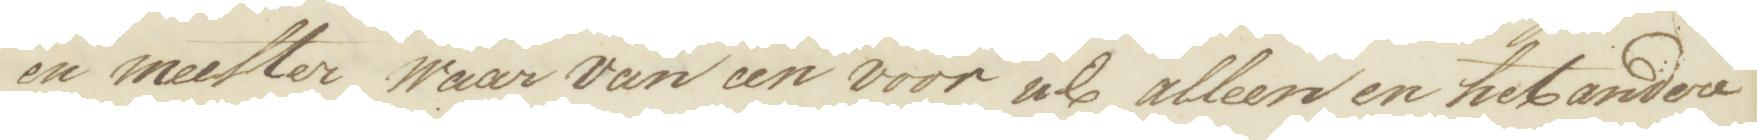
en meester waar van een voor uE alleen en het andere
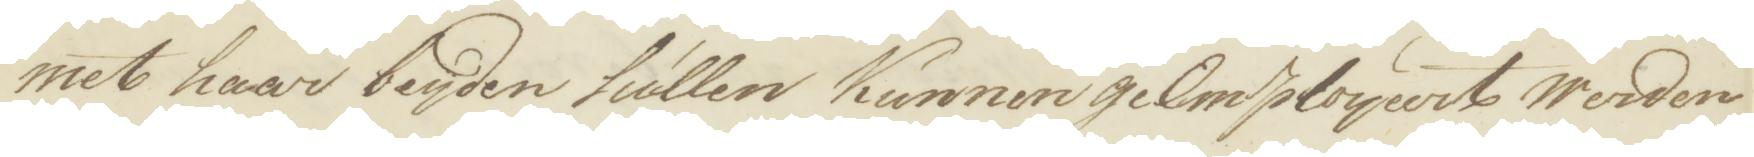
met haar beyden sullen kunnen geEmployeert werden
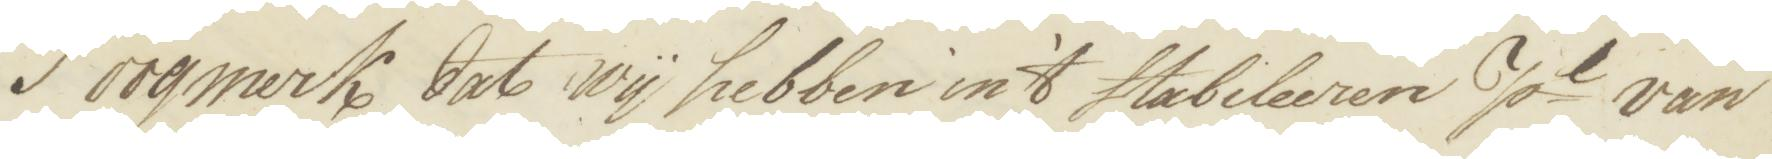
T oogmerk dat wij hebben in ’t stabileeren p=l van
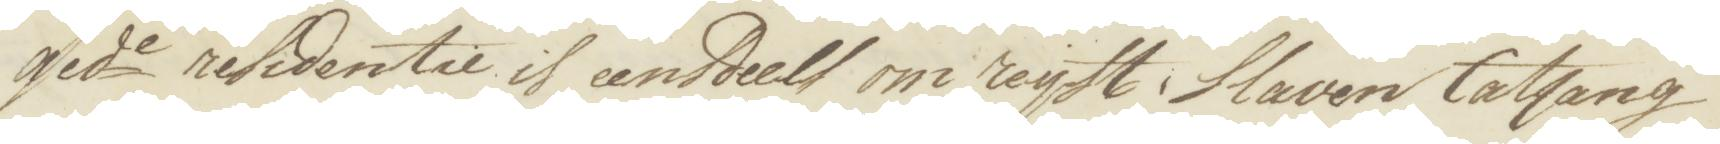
ged=e residentie is eensdeels om reijst, slaven Catjang
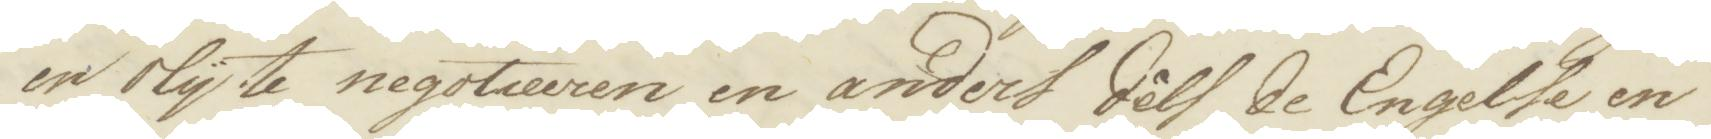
en olij te negotieeren en anders d'elf de Engelse en
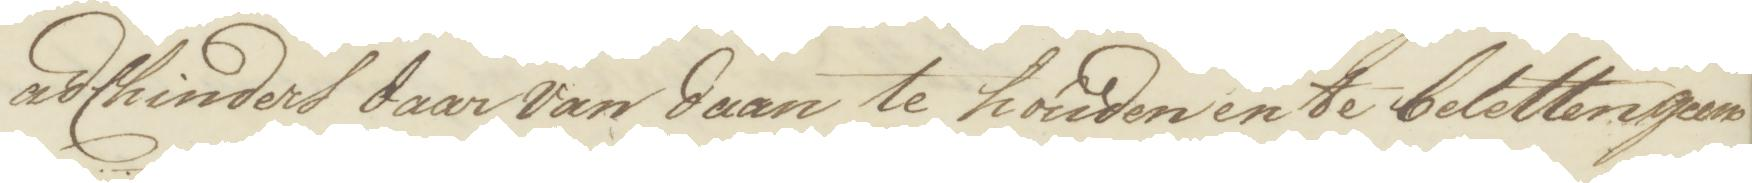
adchinders daar van daan te houden en te beletten geen
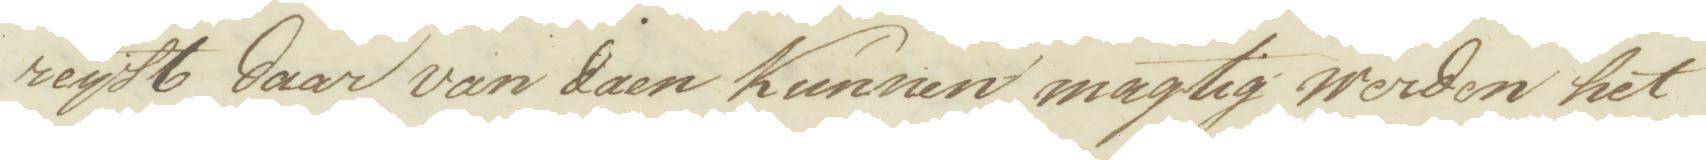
reijst daar van daen kunnen magtig werden het
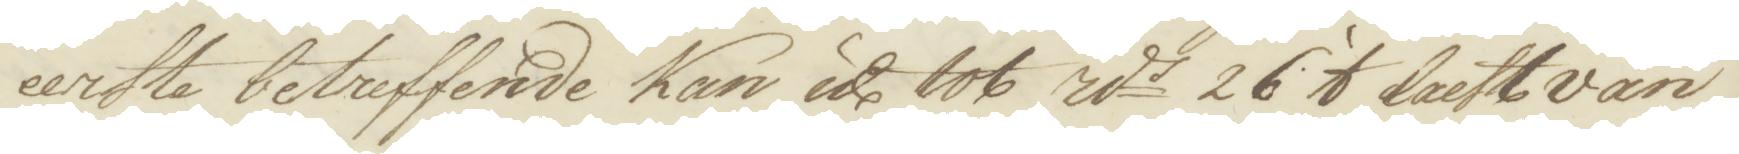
eerste betreffende kan uE tot rd=s 26 't laest van
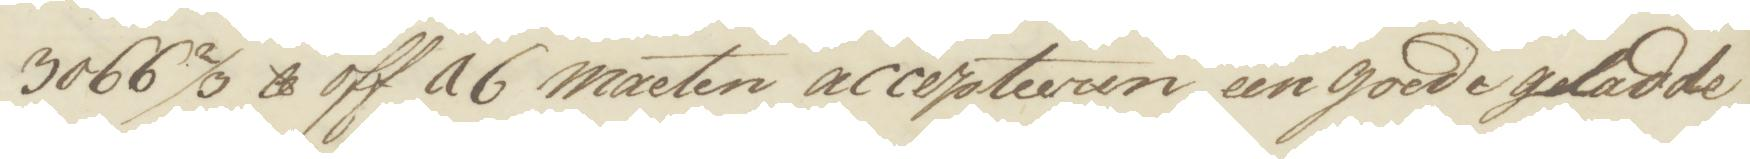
3066 2/3 lb off 46 maeten accepteeren een goede geladde
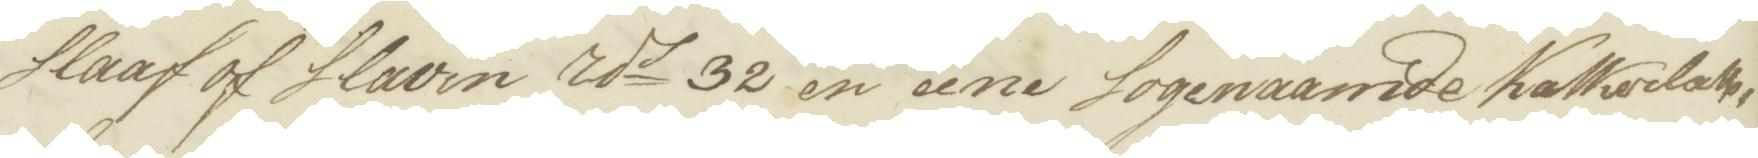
slaaf of slaven rd=s 32 en eene sogenaamde Kakkerlak„
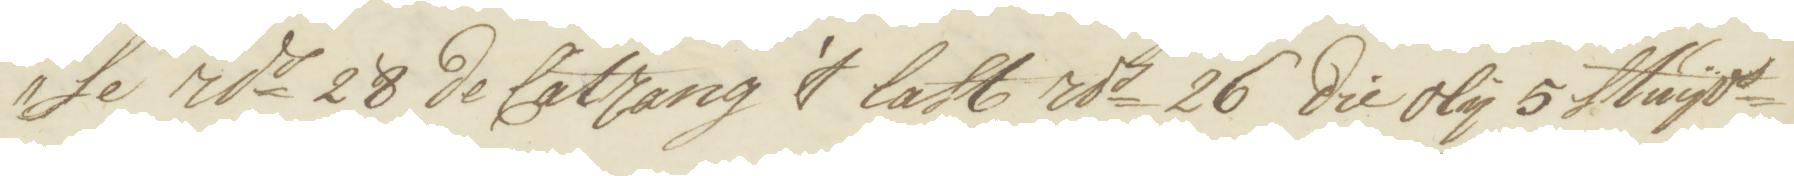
„se rd=s 28 de Catjang ’t last rd=s 26 die olij 5 stuijv=s
